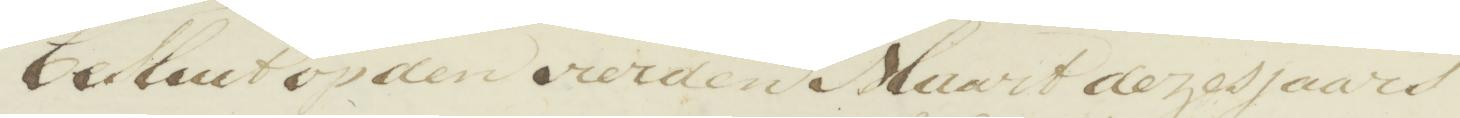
besluit op den vierden Maart dezes jaars
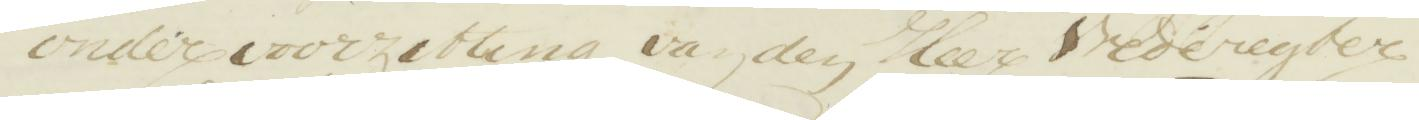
onder voorzitting van den Heer Vrederegter
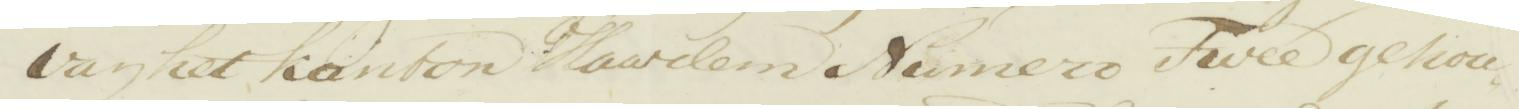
van het kanton Haarlem Numero Twee gehou„
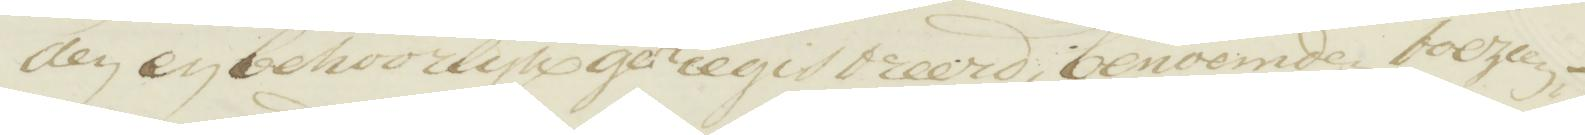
den en behoorlyk geregistreerd; benoemden toezien„
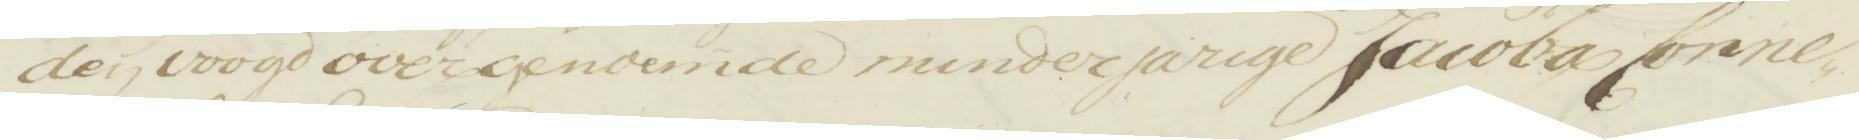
den voogd over genoemde minderjarige Jacoba Corne„
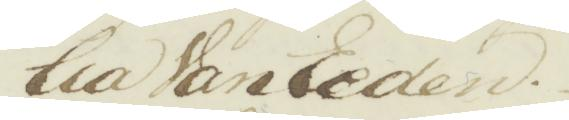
lia van Eeden.
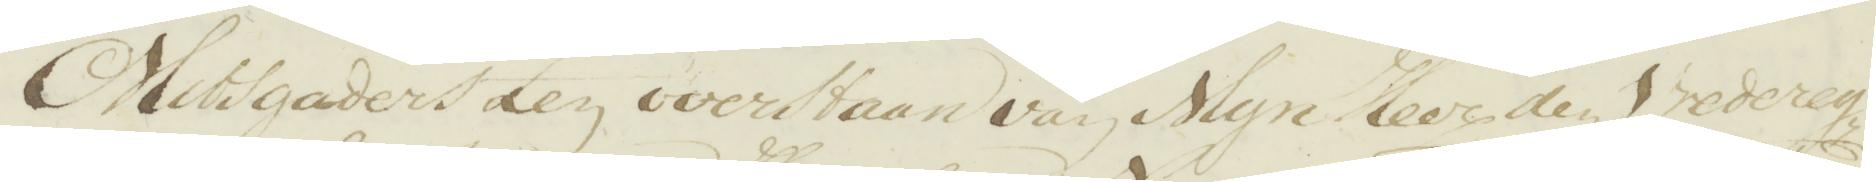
Mitsgaders ten overstaan van Myn Heer den Vredereg
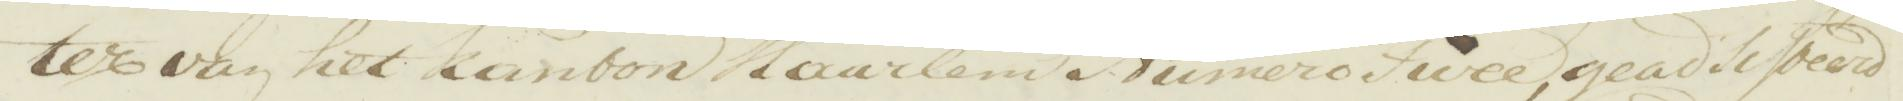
ter van het kanton Haarlem Numero Twee, geadsisteerd
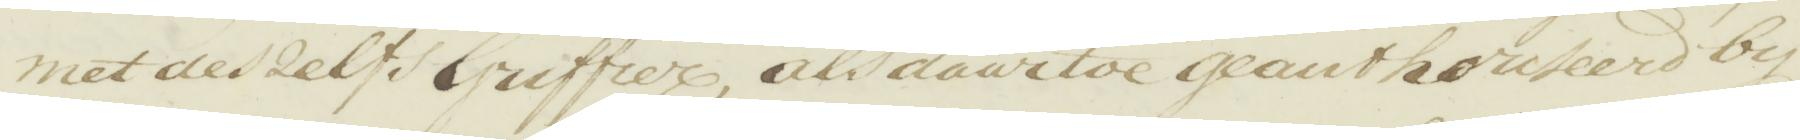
met deszelfs Griffier, als daartoe geauthoriseerd by
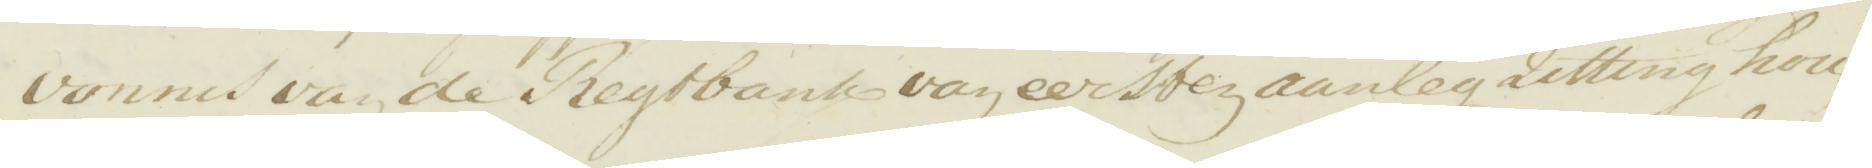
vonnis van de Regtbank van eersten aanleg zitting hou
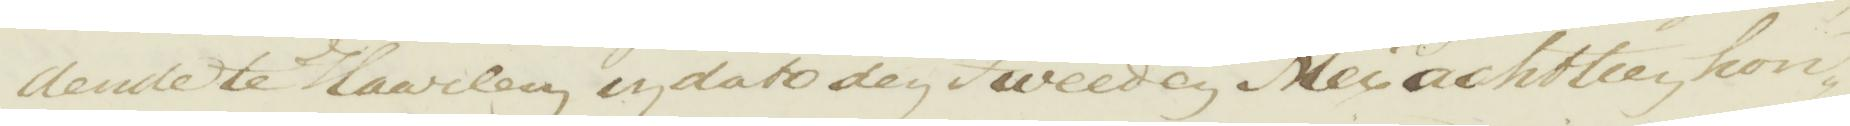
dende te Haarlem in dato den Tweeden Mei achttien hon„
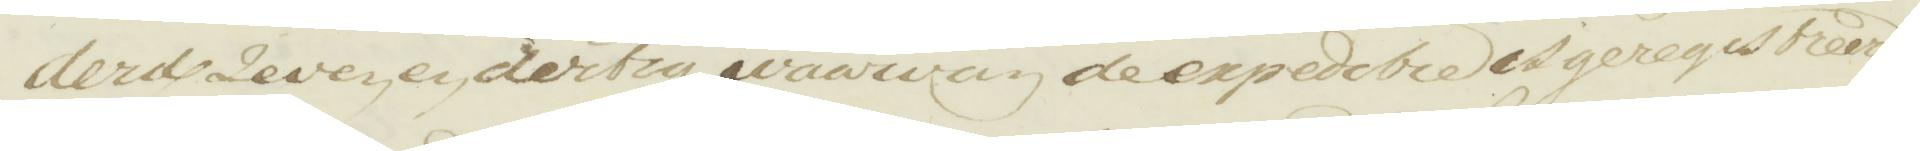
derd zeven en dertig waarvan de expeditie is geregistreerd
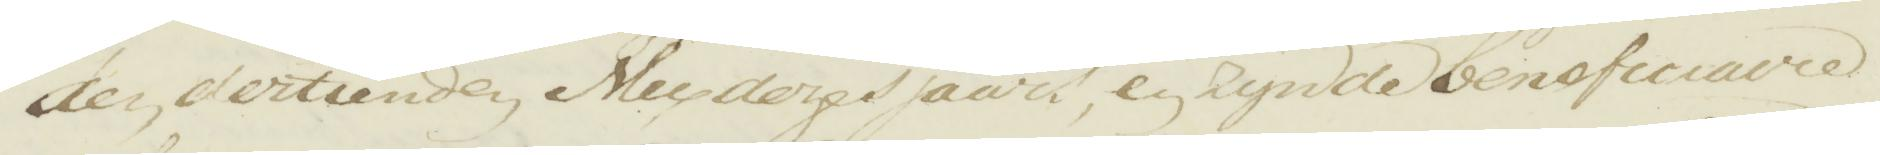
den dertienden Mei dezes jaars, en zyn de benificiaire
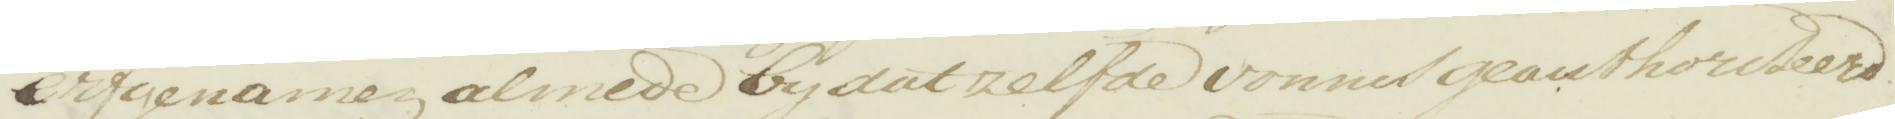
erfgenamen alsmede bij dat zelfde vonnis geauthoriseerd
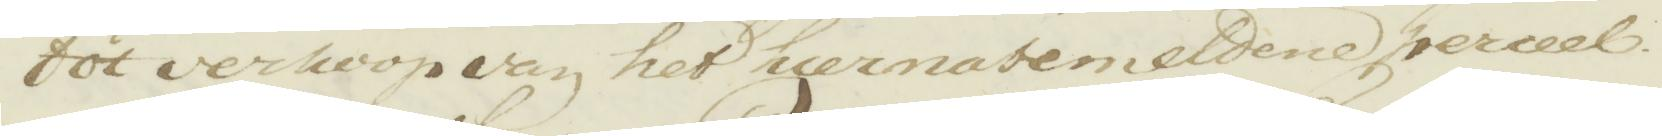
tot verkoop van het hierna temeldene perceel.
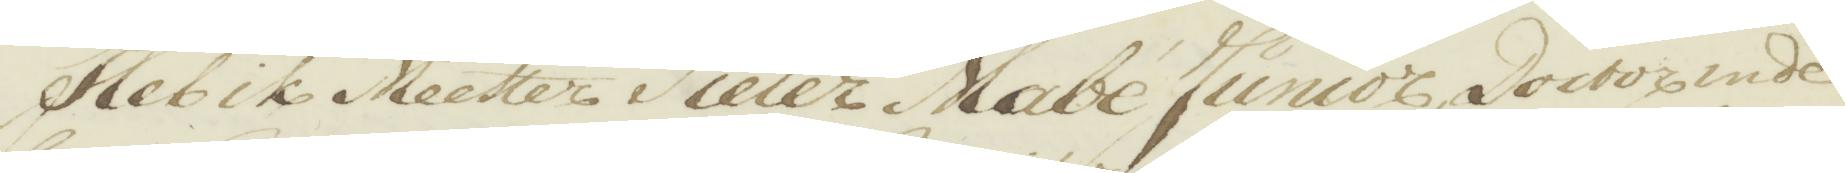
Heb ik Meester Pieter Mabé Junior, Doctor in de
